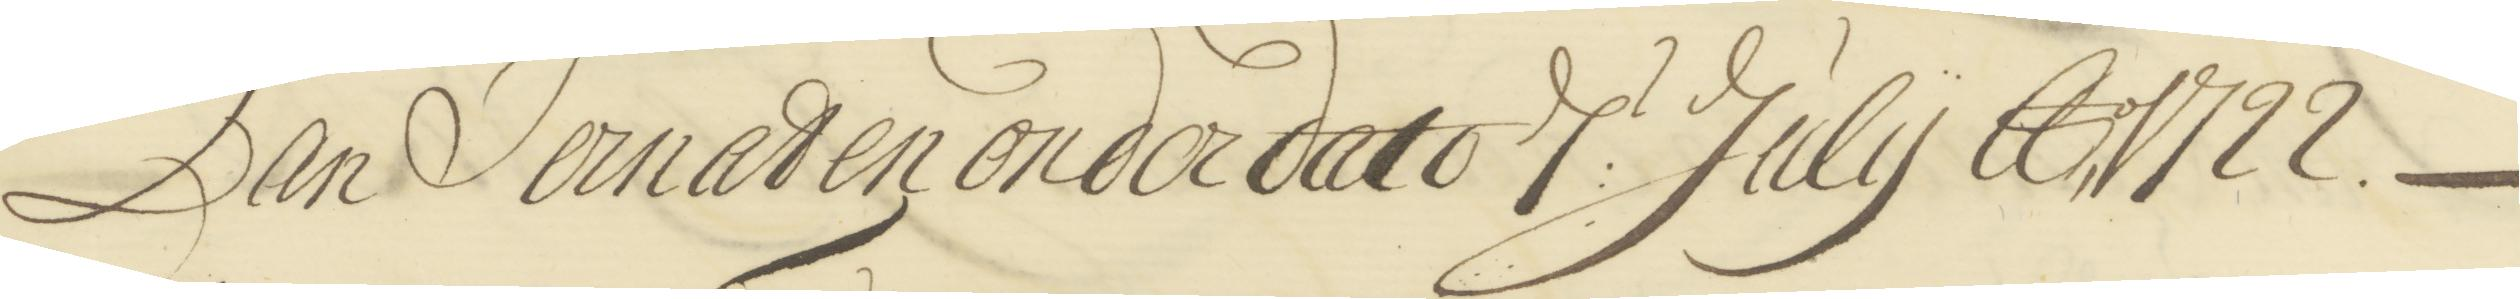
Van Ternaten onder dato 7:' Julij A„o 1722. —
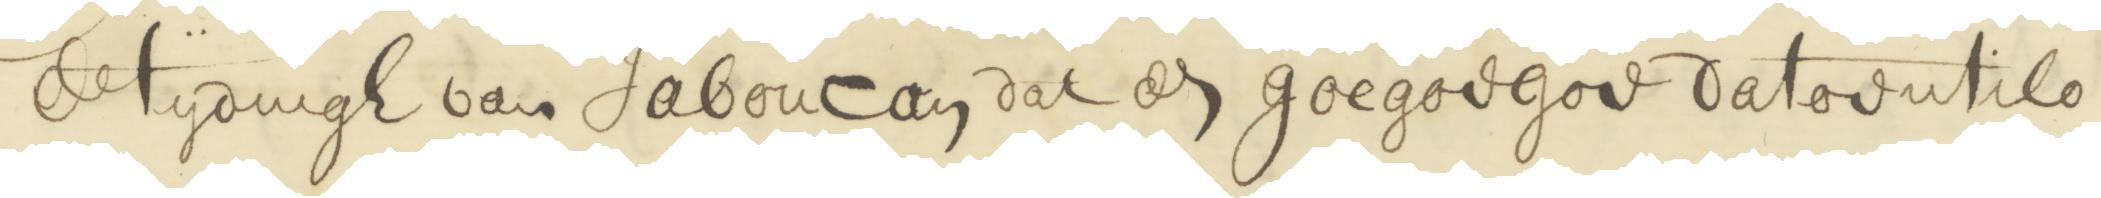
de tijdingh van Taboucan dat den goegoegoe datoentilo
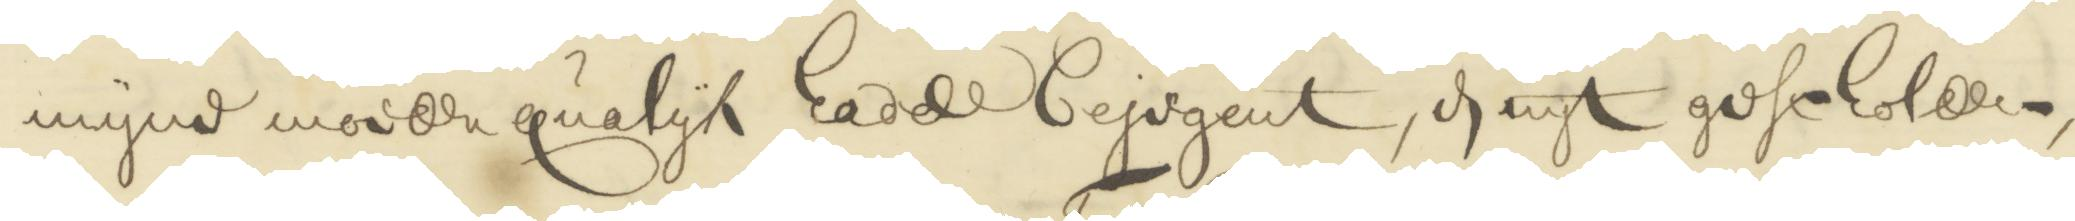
mijne moeder qualijk hadde bejegent, en uijt gescholden,
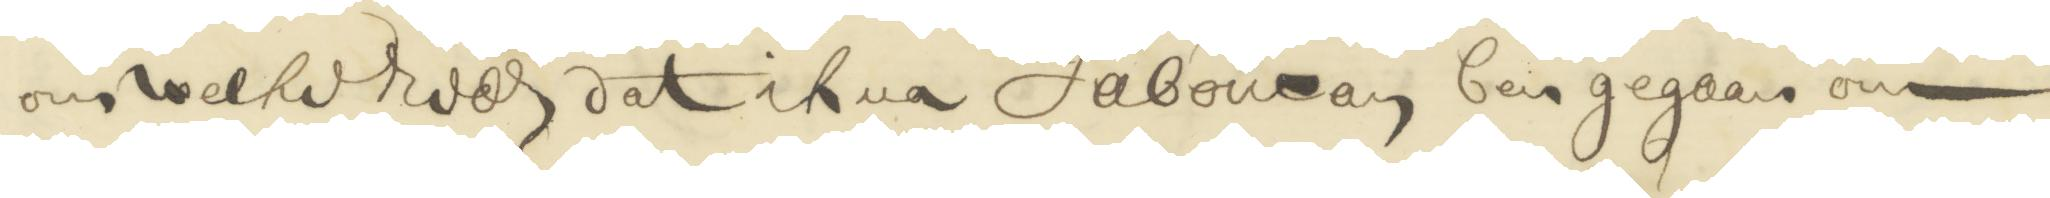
om welke reden dat ik na Taboucan ben gegaan om
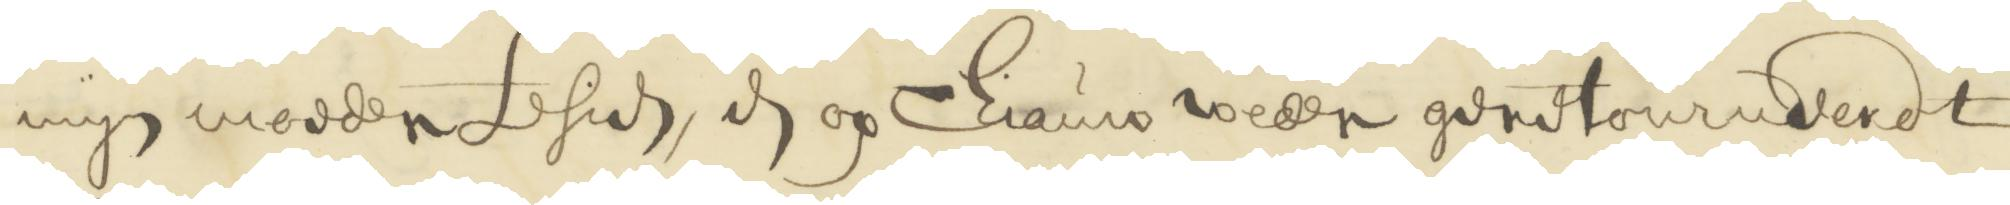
mijn moeder te sien, en op Chiauw weder geretourneerdt
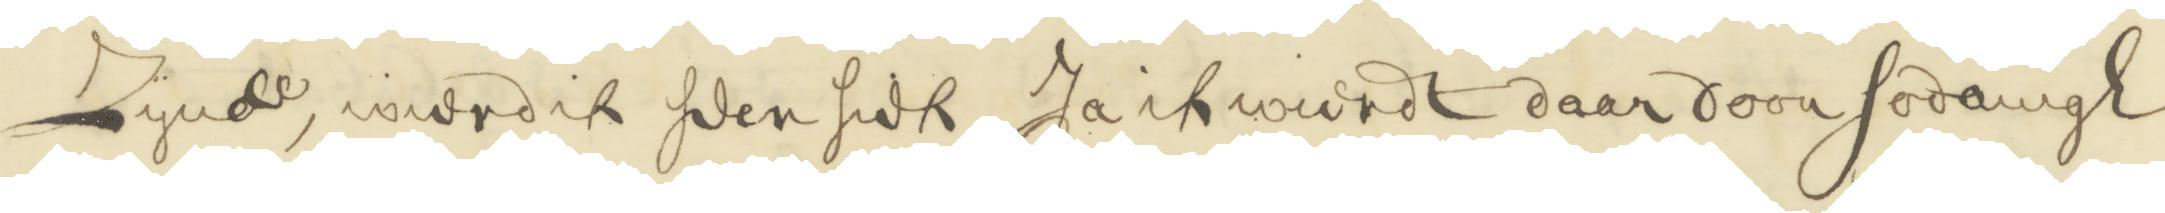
Zijnde, wierd ik seer siek, Ja ik wierdt daar door Sodanigh
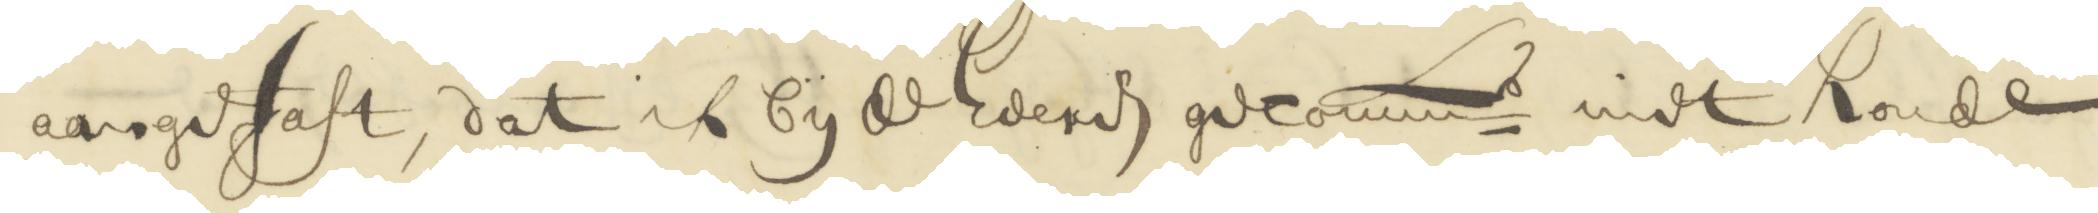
aangetast, dat ik bij de heeren gecomm=s niet konde
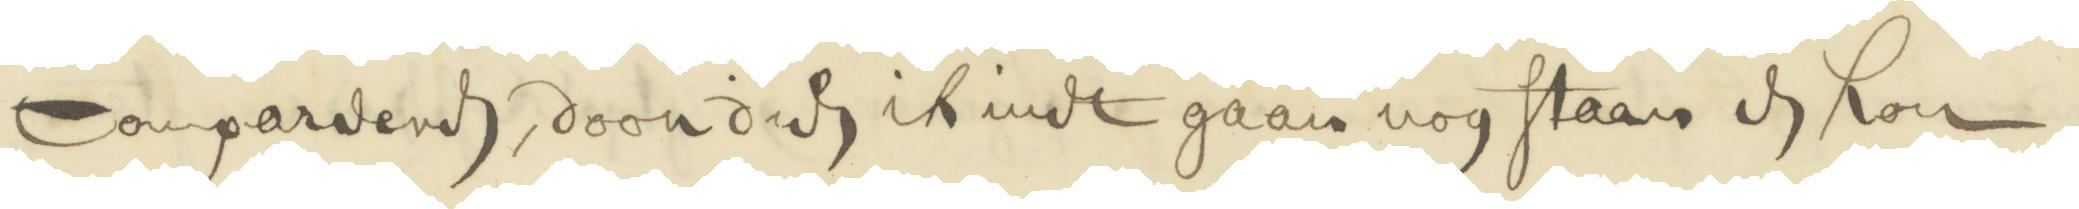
Compareeren, door dien ik niet gaan nog staan en kon,
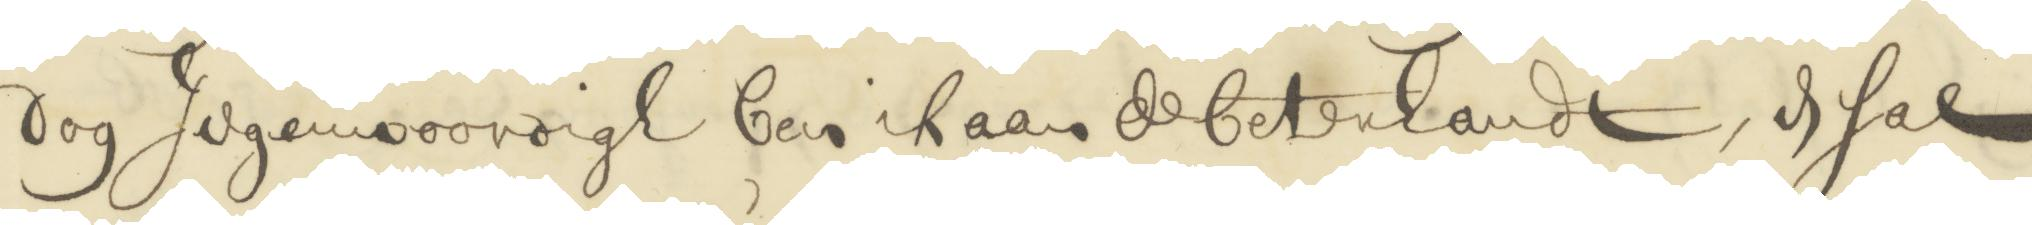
dog Jegenwoordigh ben ik aan de beterhandt, en Sal
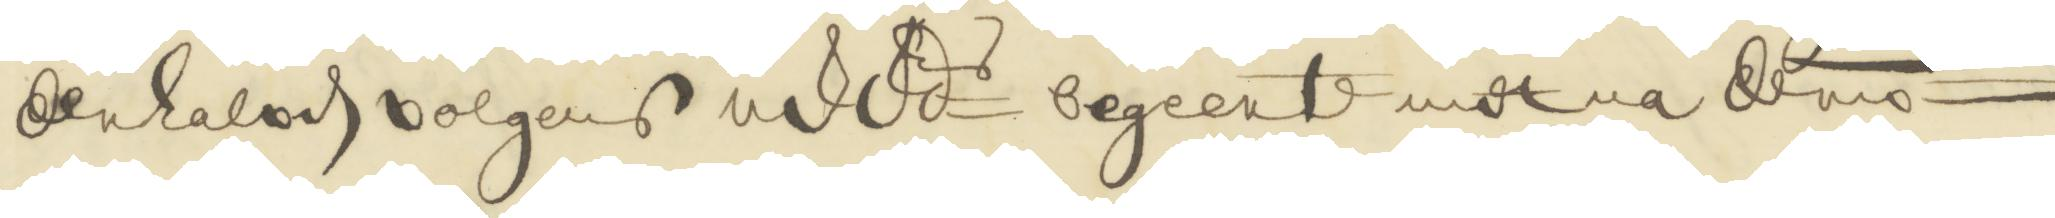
derhalven volgens uE Ed=s begeerte met na derw=ts
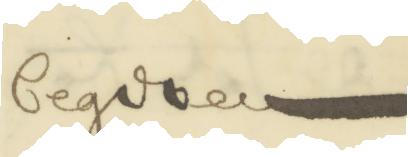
begeven.
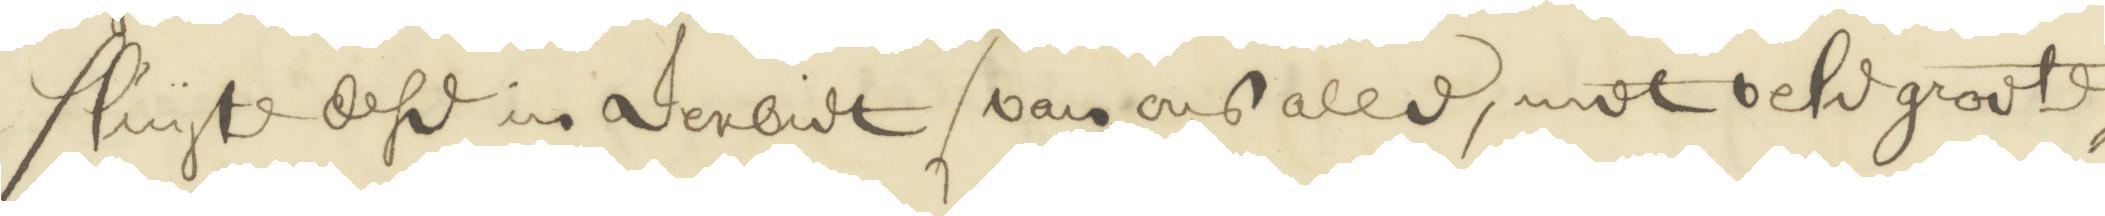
Sluijte dese in Eerbiet / van ons alle, met vele groete„
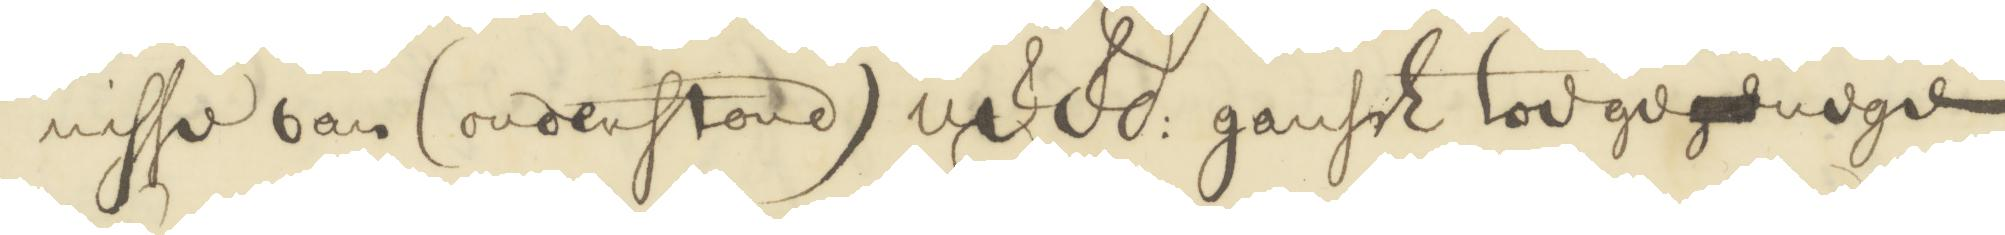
nisse van (onderstond) uE Ed: gansch toegegenege
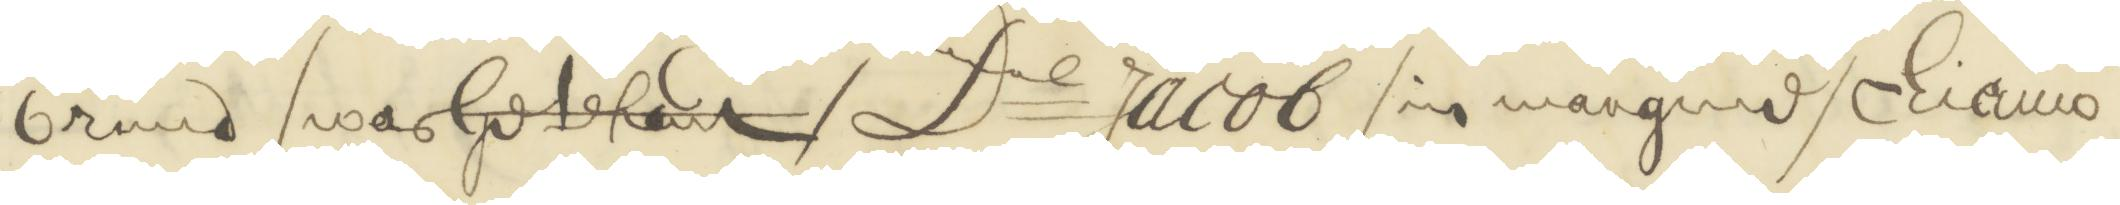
vrund /was Getekent/ D=l Jacob /in margine / Chiauw,
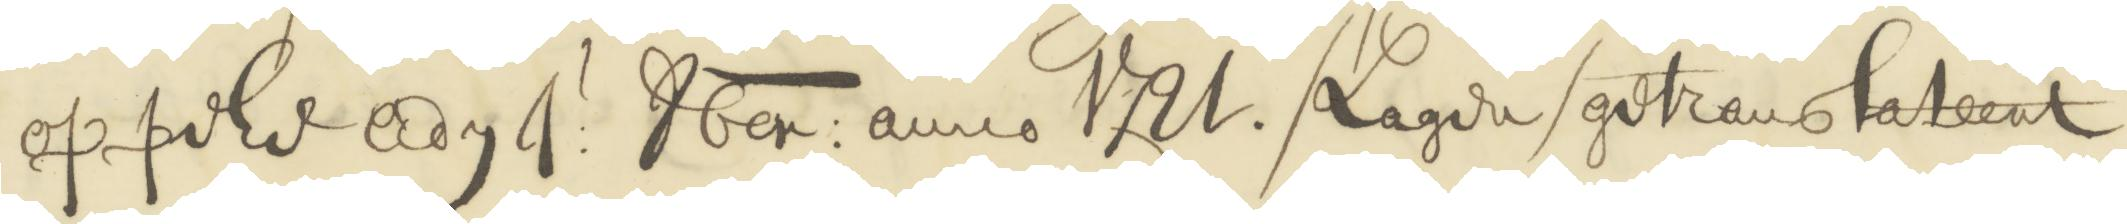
op pehe ady 4:' 8ber: anno 1721. /Lager/ getranslateert
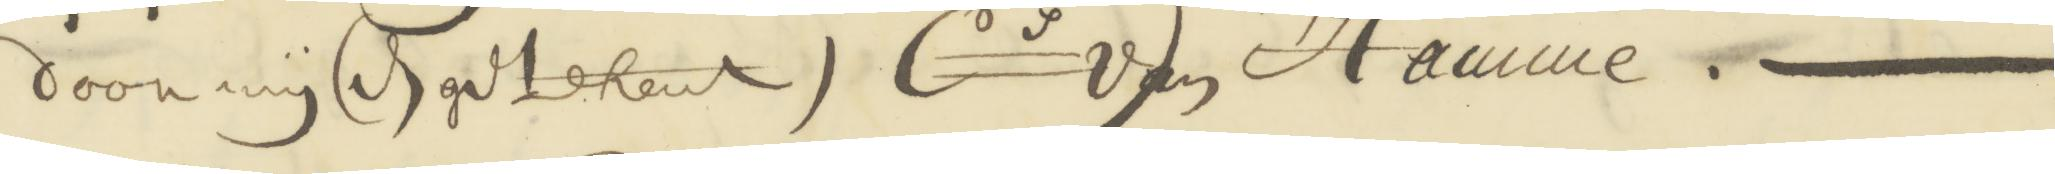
door mij (en getekent) C=s van Hamme.-
